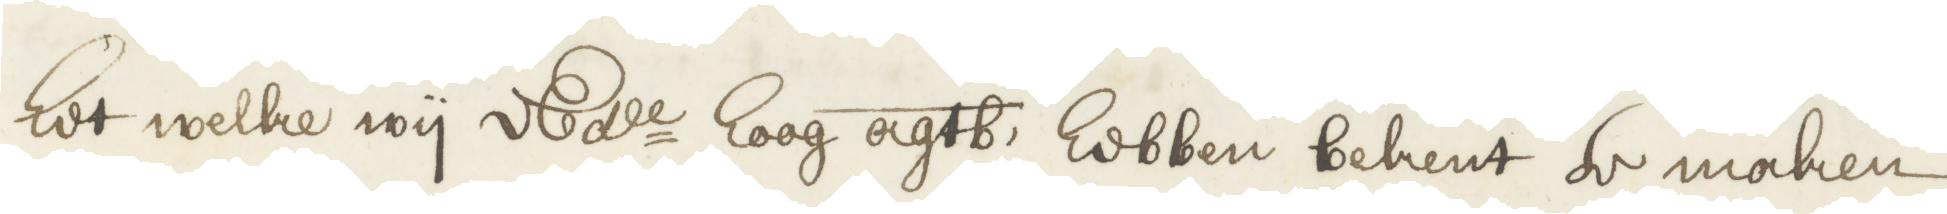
het welke wij UEd=e hoog agtb: hebben bekent te maken
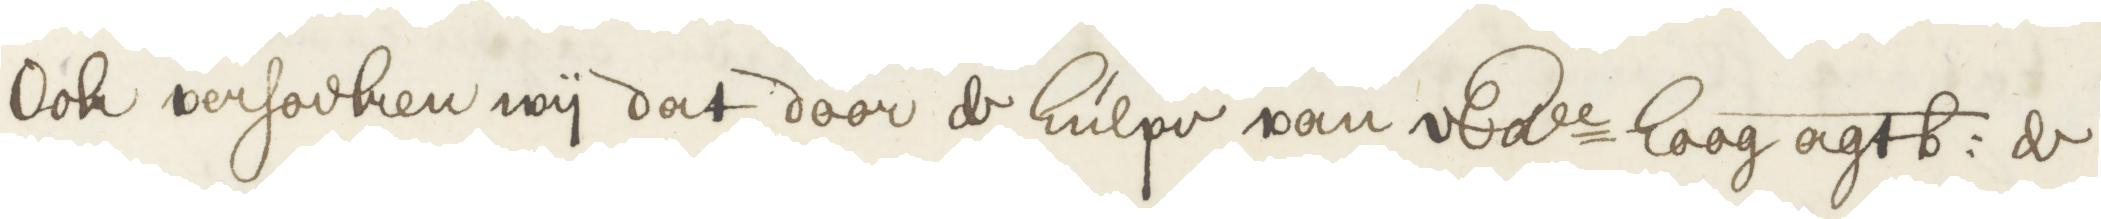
Ook versoeken wij dat door de hulpe van uEd=le hoog agtb: de
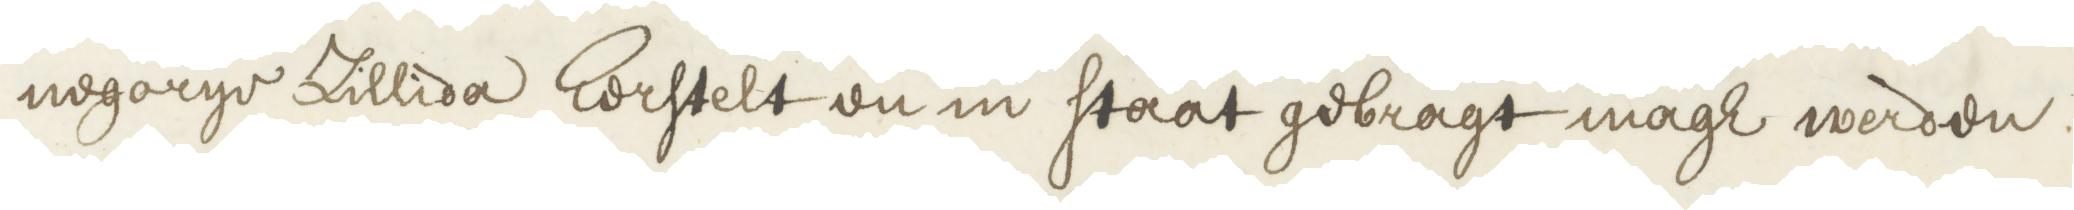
negorije zillida herstelt en in staat gebragt magh werden
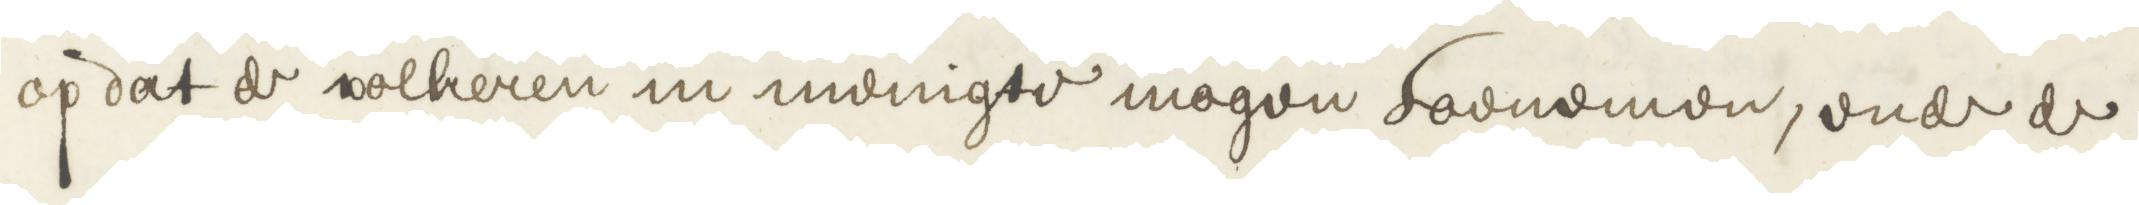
op dat de volkeren in menigte mogen toenemen, ende de
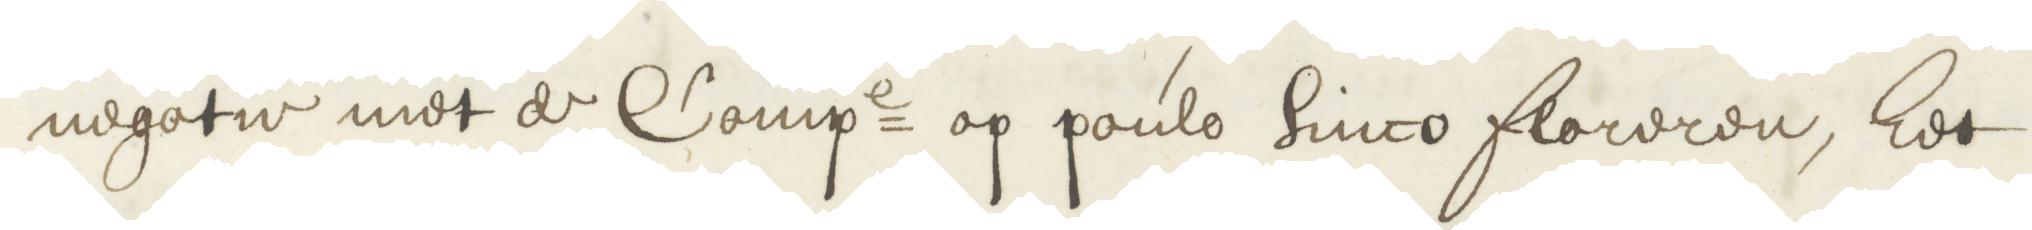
negotie met de Comp=e op poulo sinco floreren, het
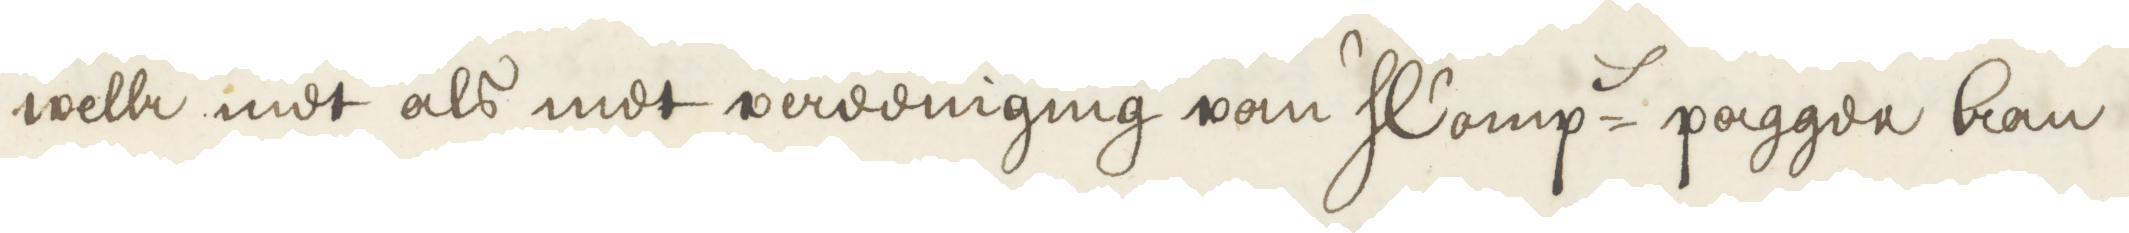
welk niet als met vereeniging van 'sComp=s pagger kan
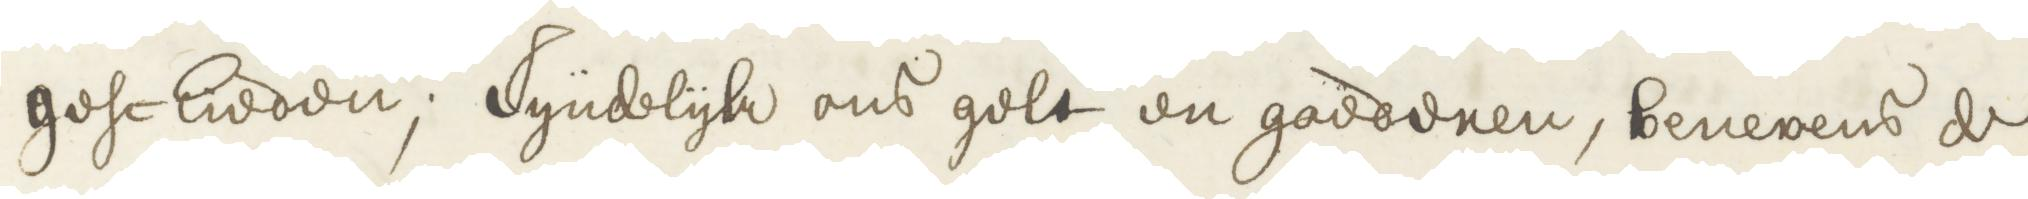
geschieden; Eijndelijk ons gelt en goederen, benevens de
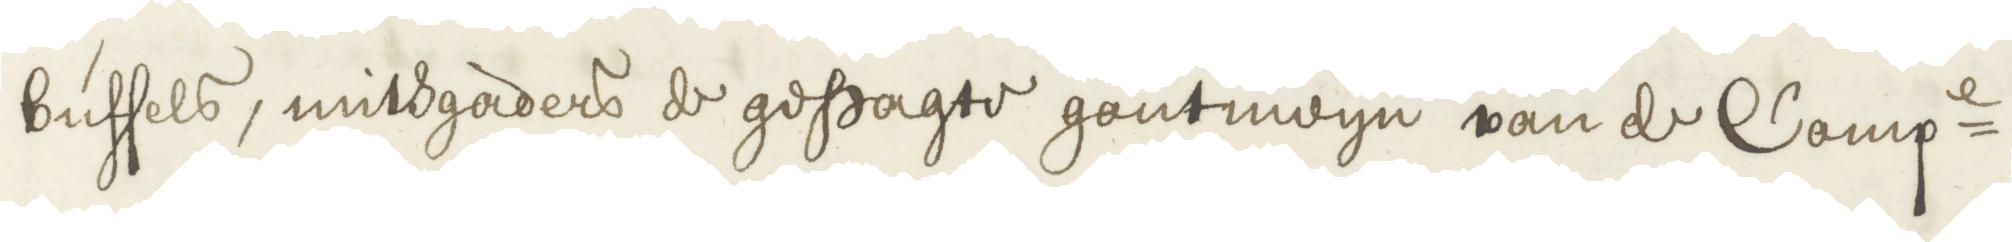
buffels, mitsgaders de gepagte goutmeijn van de Comp=s
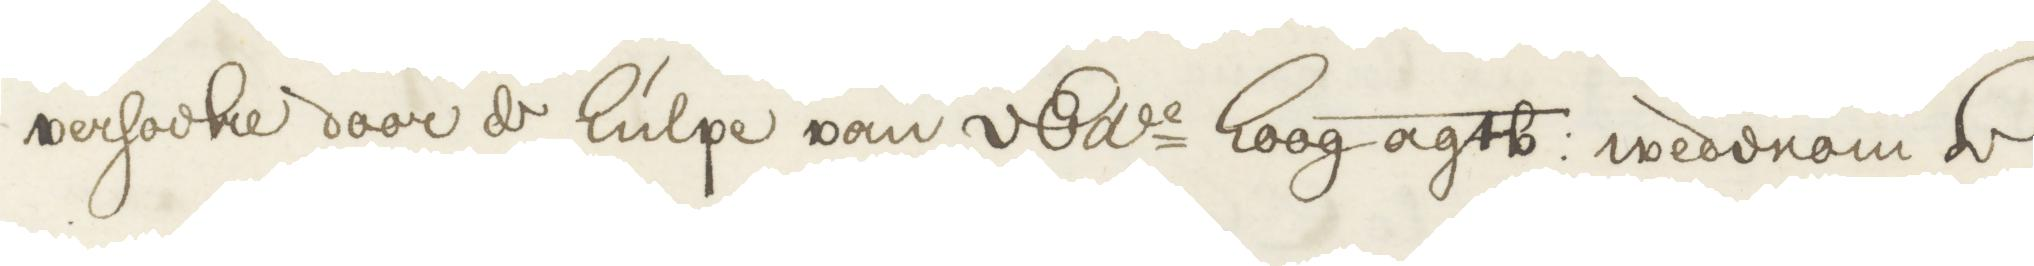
versoeke door de hulpe van uEd=e hoog agtb: wederom te
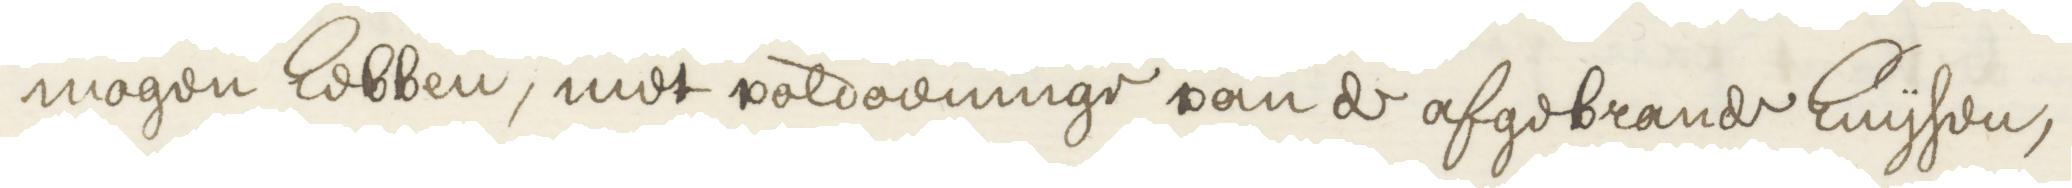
mogen hebben, met voldoeninge van de afgebrande huijsen,
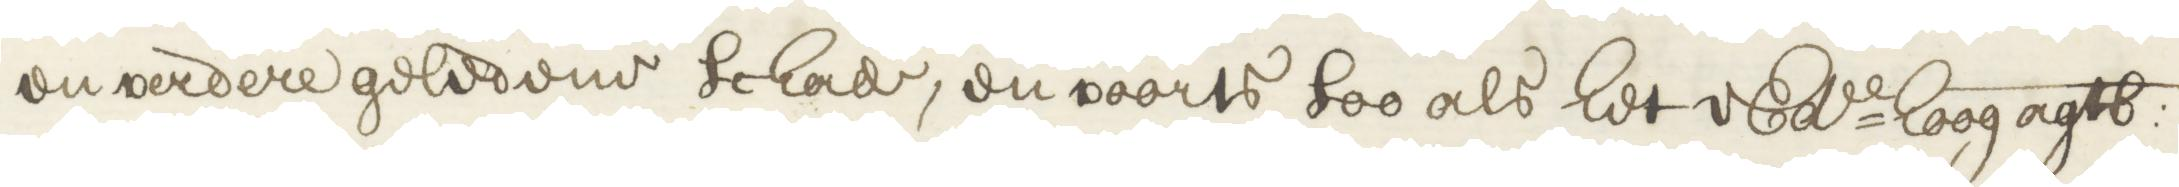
en verdere geledene schade, en voorts soo als het uEd=le hoog agtb:
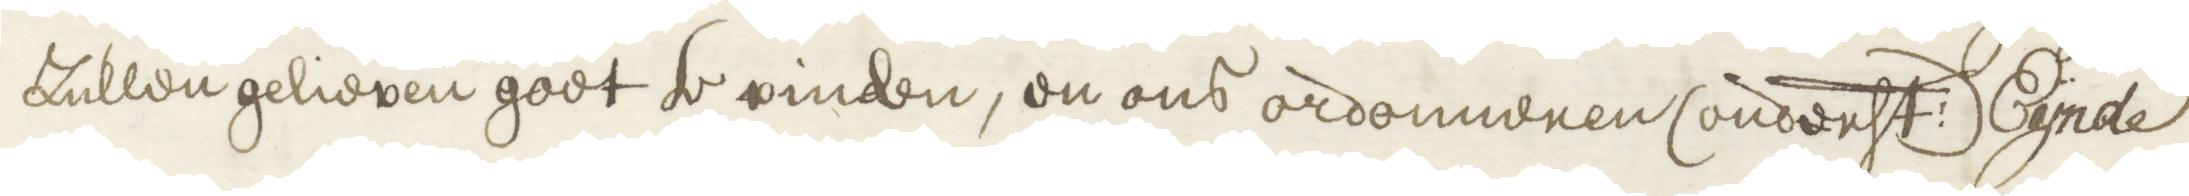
zullen gelieven goet te vinden, en ons ordonneren (onderst:) Eijnde
